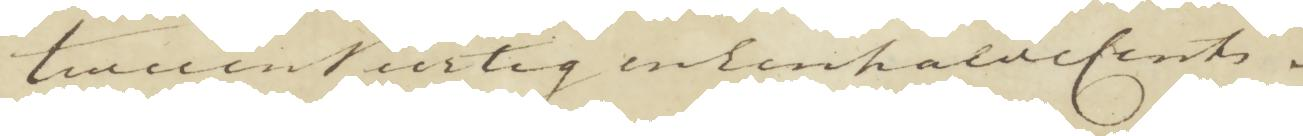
tweeenVeertig enEenhalveCents
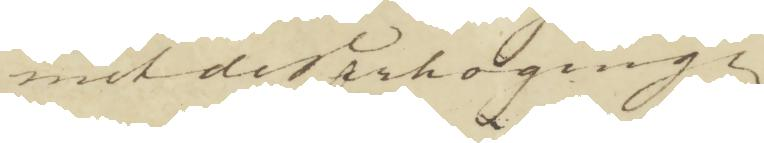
met deVerhogingen
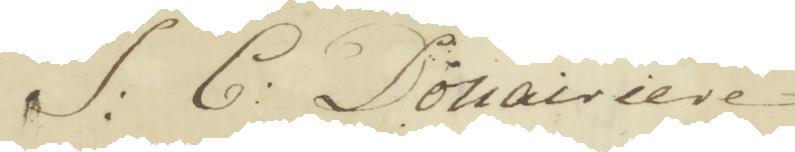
I: C: Douairiere
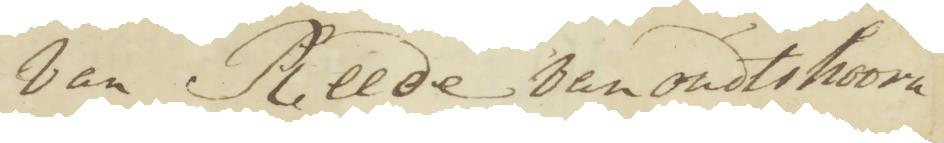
van Reede van oudtshoorn
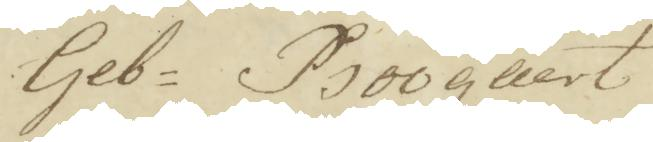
Geb= Boogaert
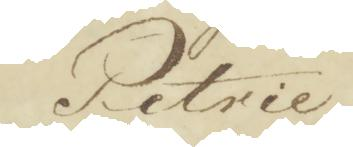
Petrie
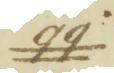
qq.
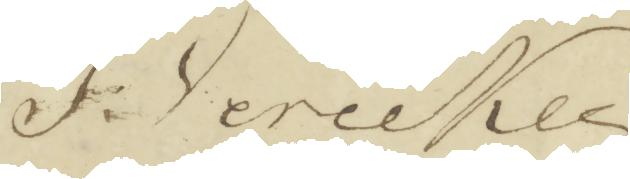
J: Vereeken
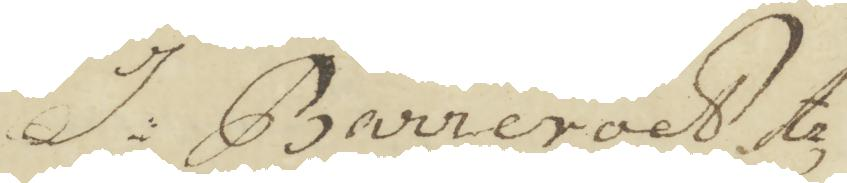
I: Barrevoet Az
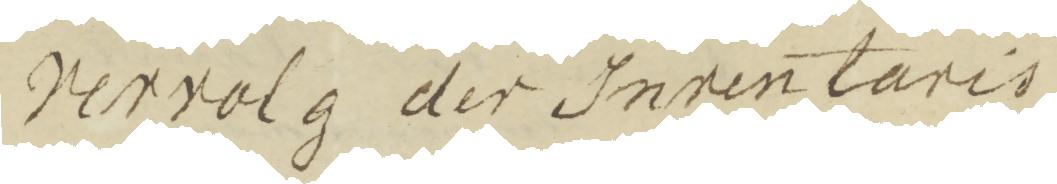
vervolg der Inventaris
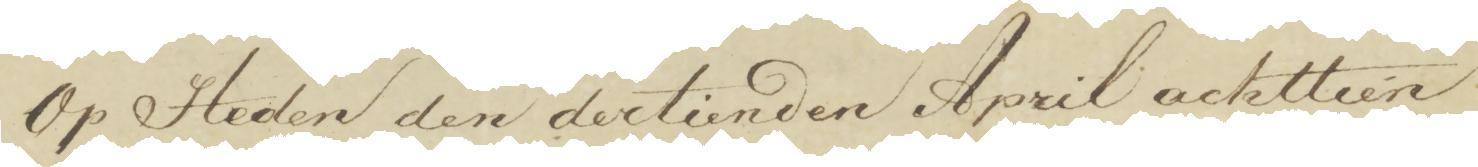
Op Heden den dertienden April achttien
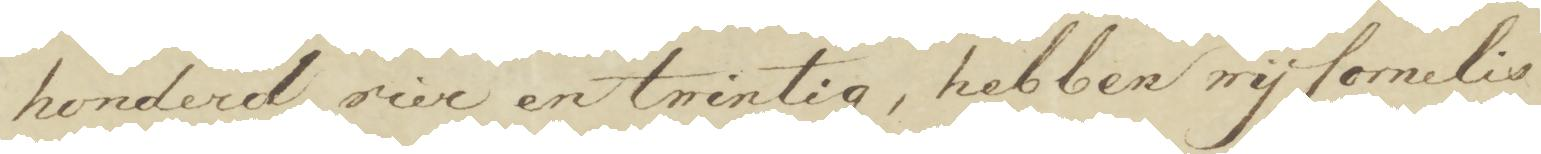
honderd vier en twintig, hebben wij Cornelis
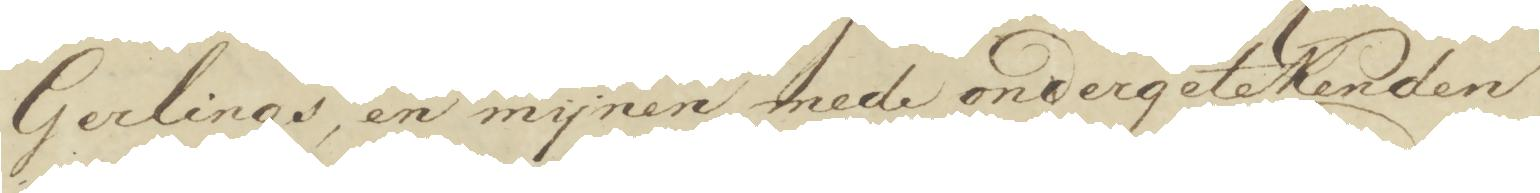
Gerlings, en mijnen mede ondergetekenden
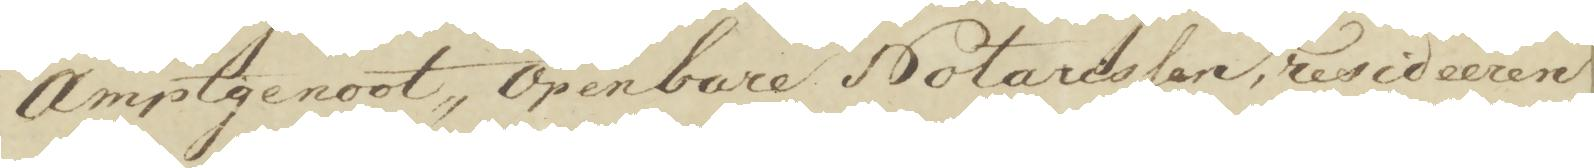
Amptgenoot, Openbare Notarissen, resideeren
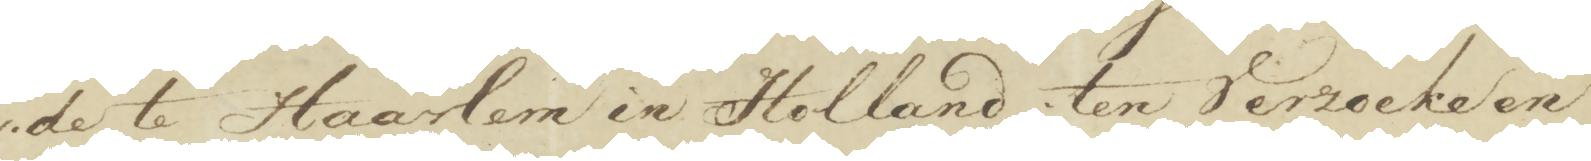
.de te Haarlem in Holland, ten Verzoeke en
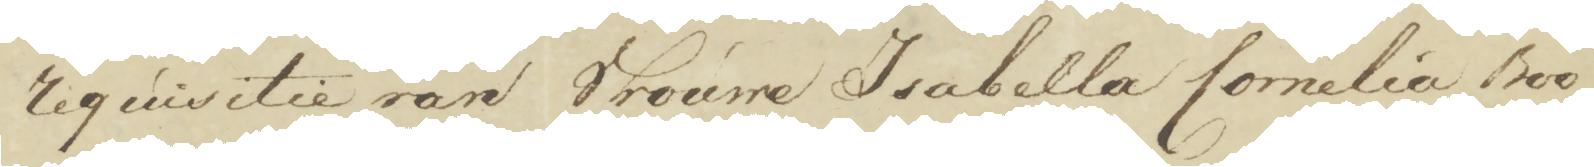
requisitie van Vrouwe Isabella Cornelia Boo
